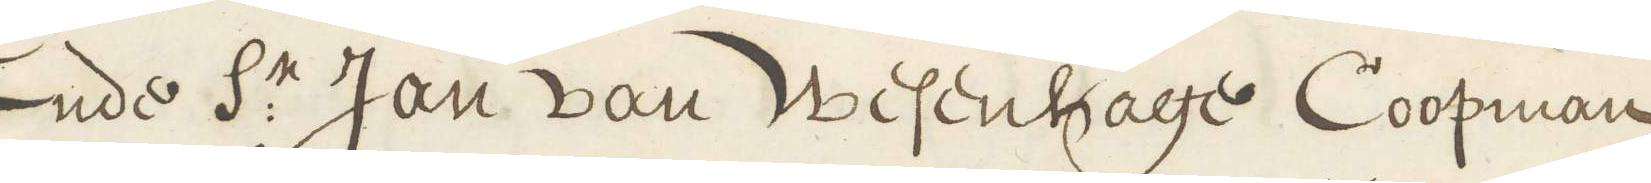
Ende s:r Jan van Wesenhage Coopman
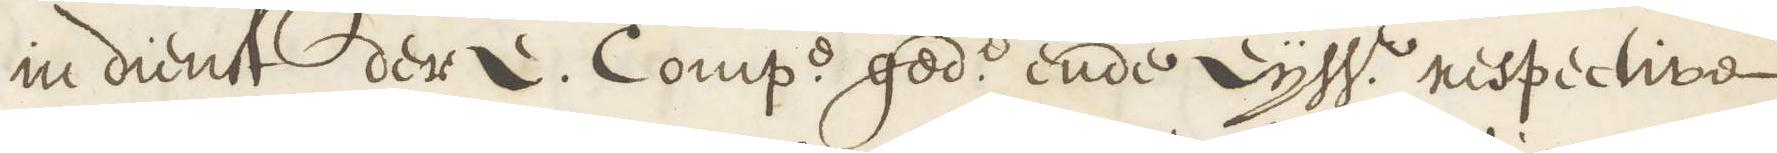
in dienst der E. Comp.s ged.e ende Eijss.r respective
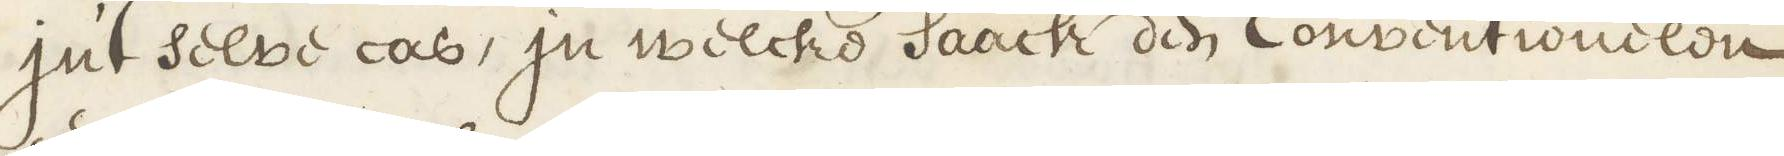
jn't selve cas, jn welcke saack den conventionelen
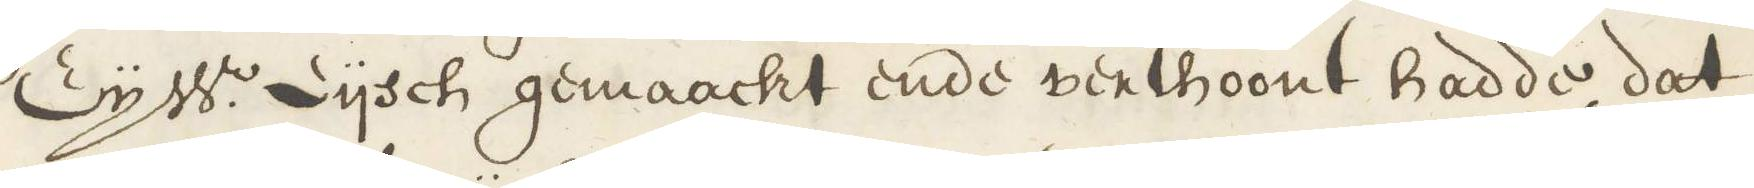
Eijss.r Eijsch gemaackt ende verthoont hadde, dat
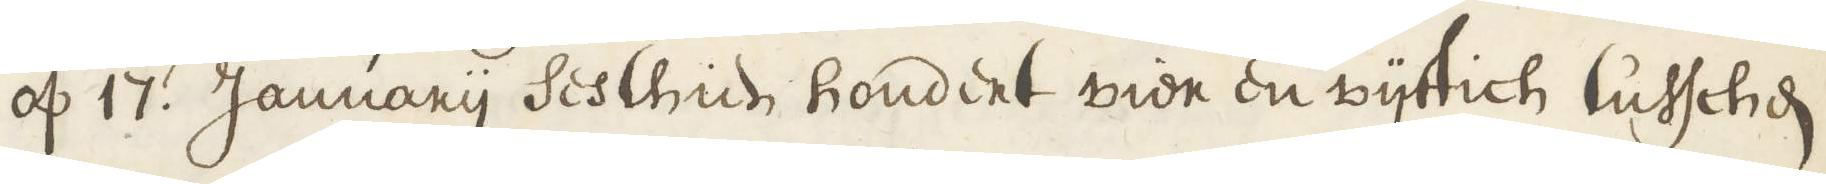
op 17.' Januarij sesthien hondert vier en vijftich tusschen
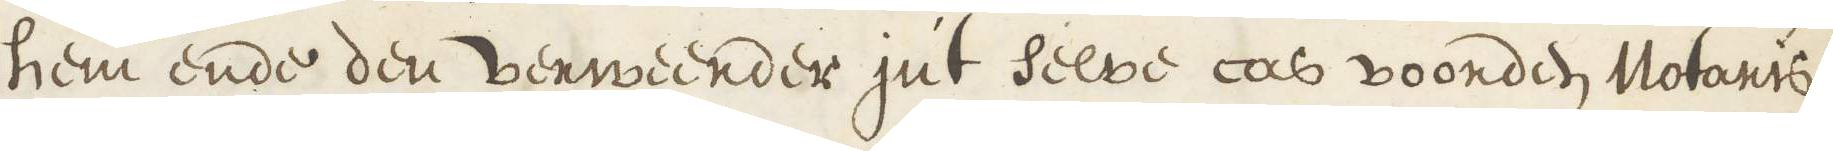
hem ende den verweerder jn't selve cas voorden Notaris
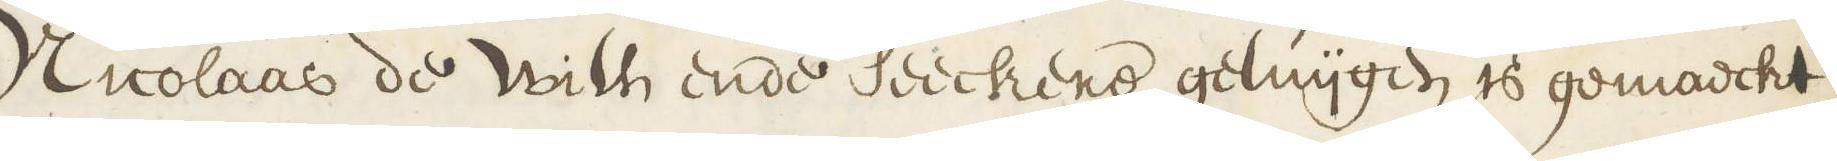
Nicolaas de with ende seeckere getuijgen is gemaeckt
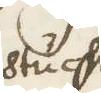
stuck
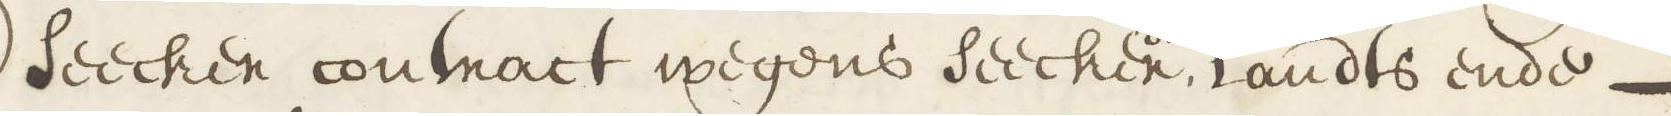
seecker contract wegens seecker. landts ende —
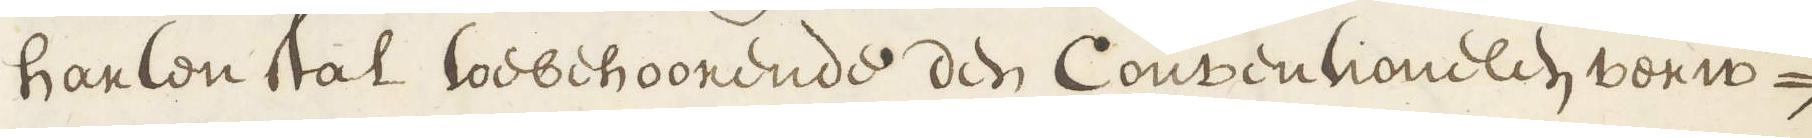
harten stal toebehoorende den Conventionelen verw=r,
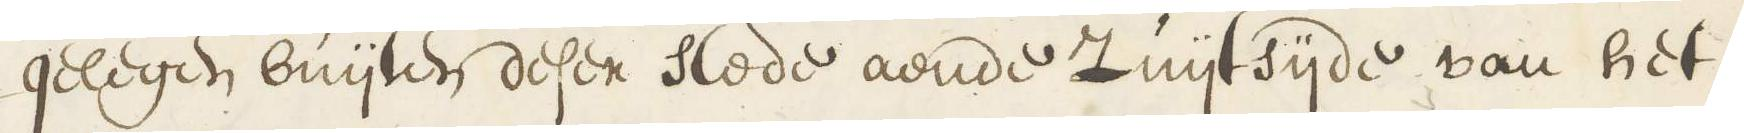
gelegen buijten deser stede aende Zuijtsijde van het
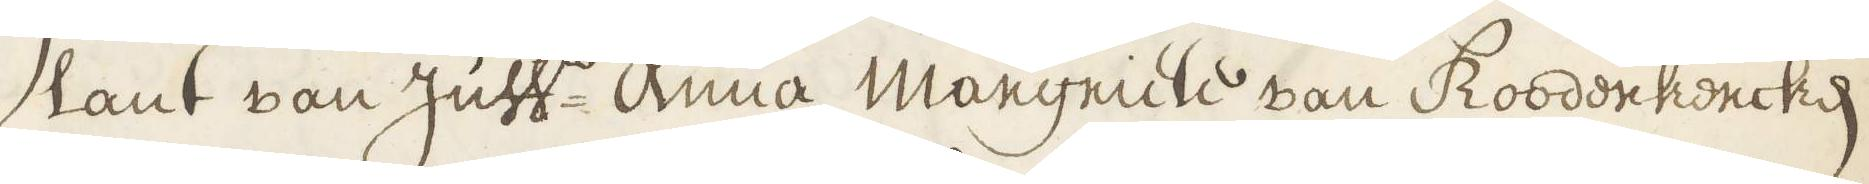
lant van Juff=r Anna Margriete van Rooderkercken
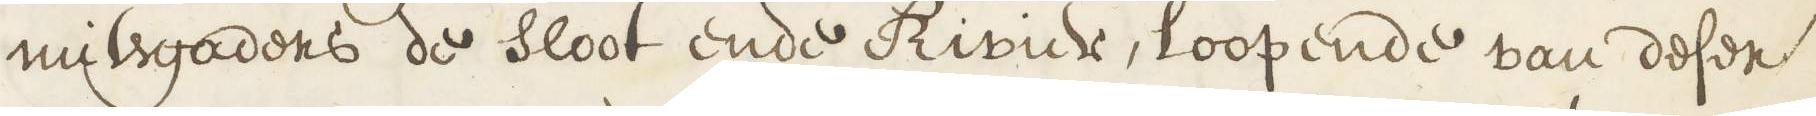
mitsgaders de sloot ende Rivier, loopende van deser
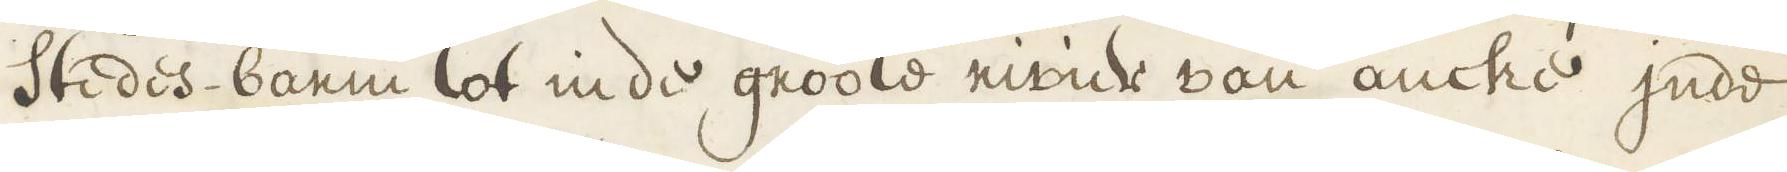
stedes-barm tot in de groote rivier van ancke jnde
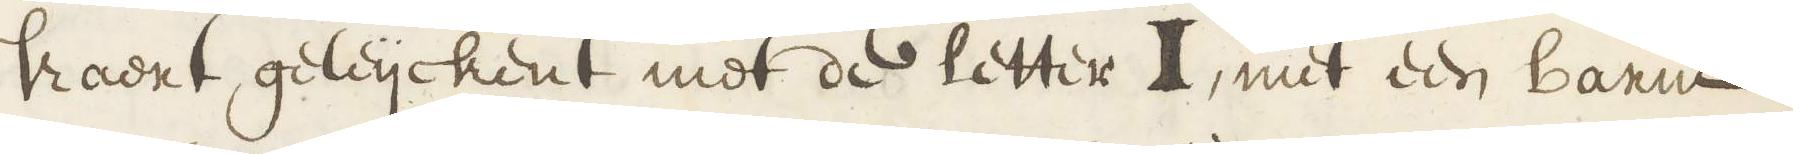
kaert geteijckent met de letter I, met een barm
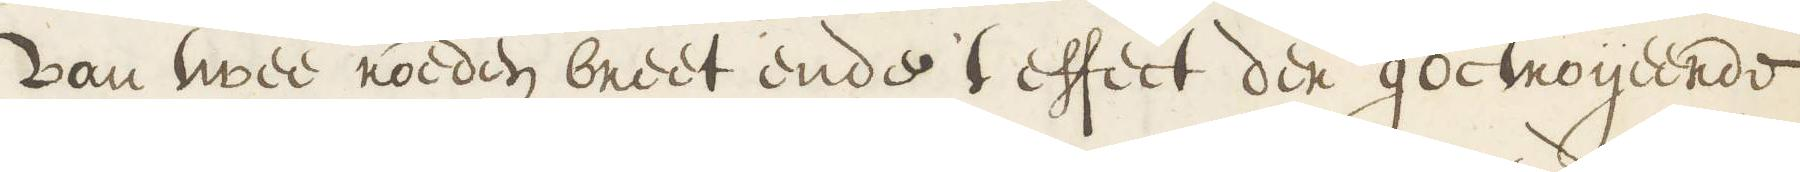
van twee roeden breet ende ’t effect der g'octroijeerde
